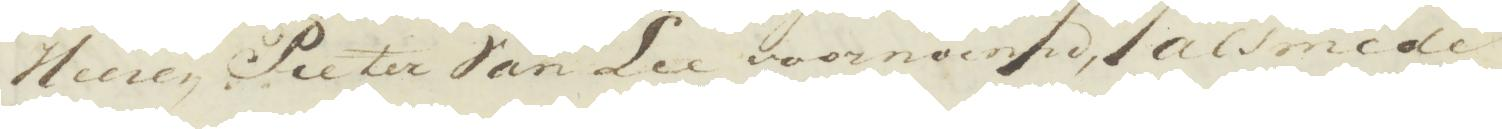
Heeren Pieter Van Lee voornoemd, alsmede
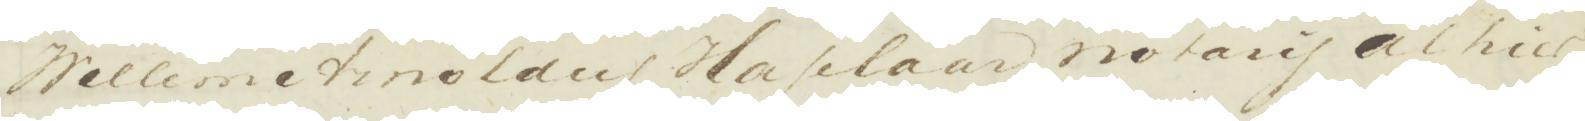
Willem Arnoldus Haselaar, notaris alhier,
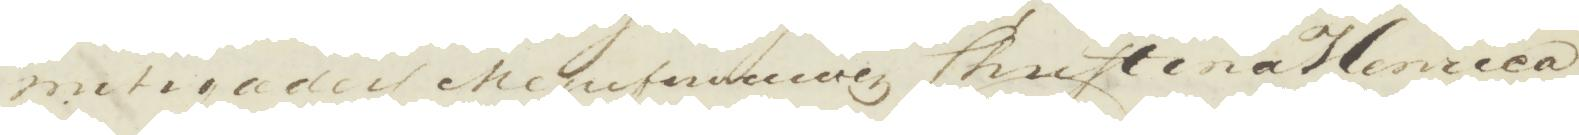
mitsgaders Mejufvrouwen Christina Henrica
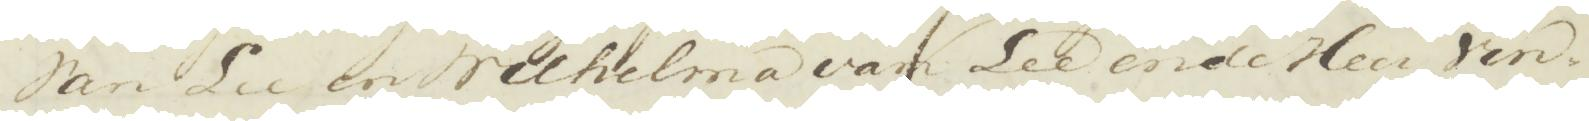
Van Lee en Wilhelma van Lee ende Heer Vin„
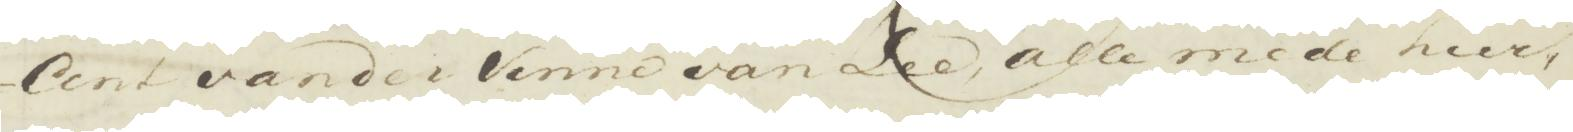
cent van der Vinne van Lee, alle mede hier„
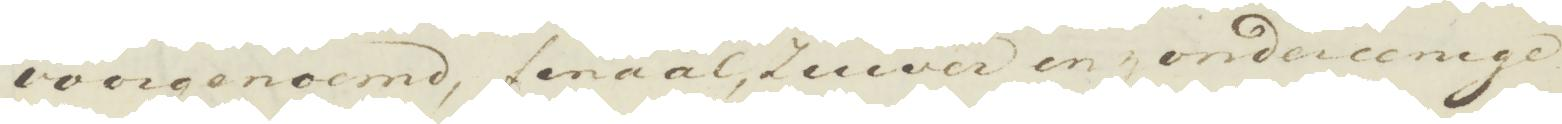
voorgenoemd, finaal, zuiver en zonder eenige
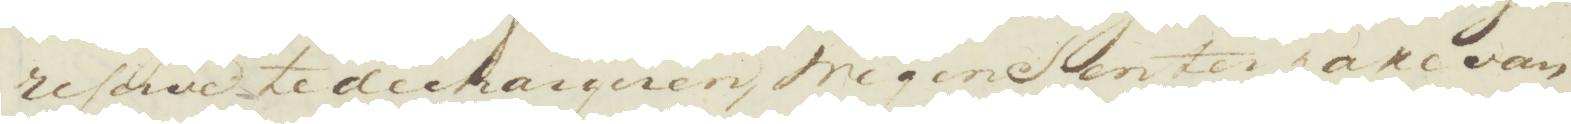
reserve te dechargeren, wegens en ter zake van
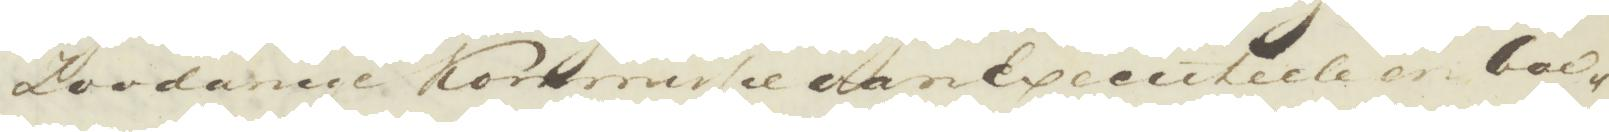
zoodanige Kommissie van Executeele en boe
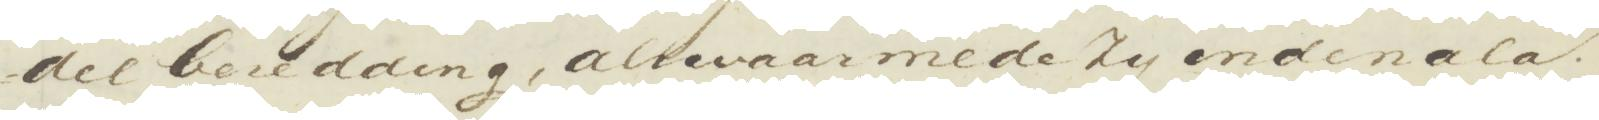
=del beredding, alswaar mede zy in de na la.
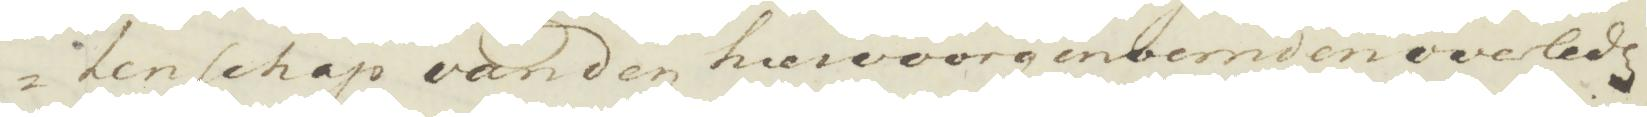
= tenschap van den hiervoorgenoemden overleden
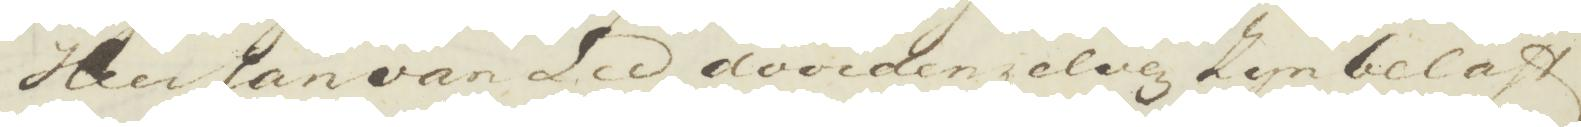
Heer Jan van Lee, door den zelve zyn belast
